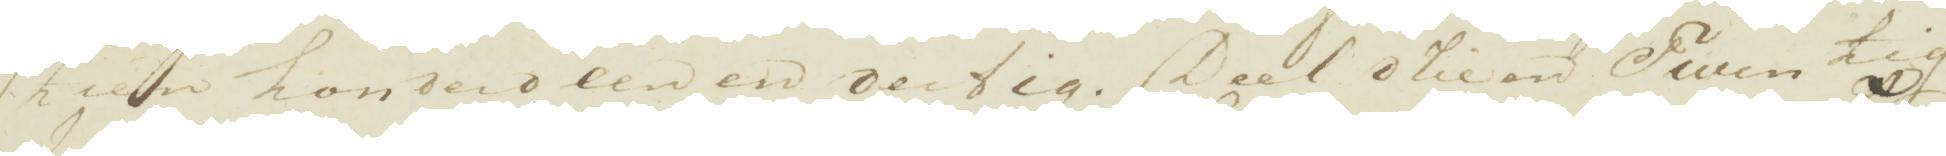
tien honderd een en dertig. Deel drie en Twintig
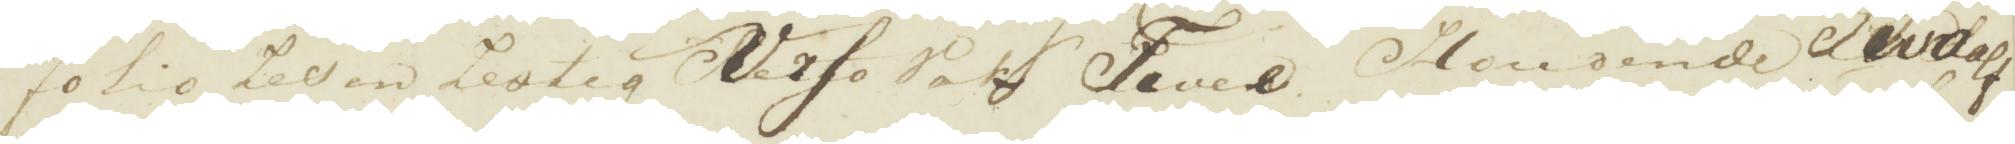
folio zes en zestig Verso Vak Twee Houdende Twaalf
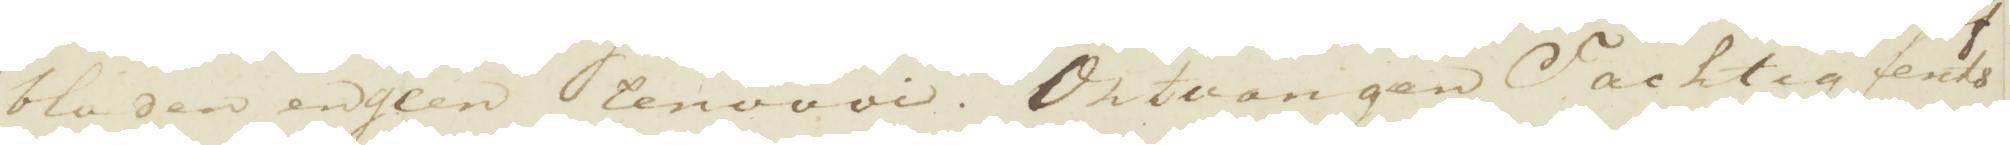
bladen en geen renvooi. Ontvangen Tachtig Cents
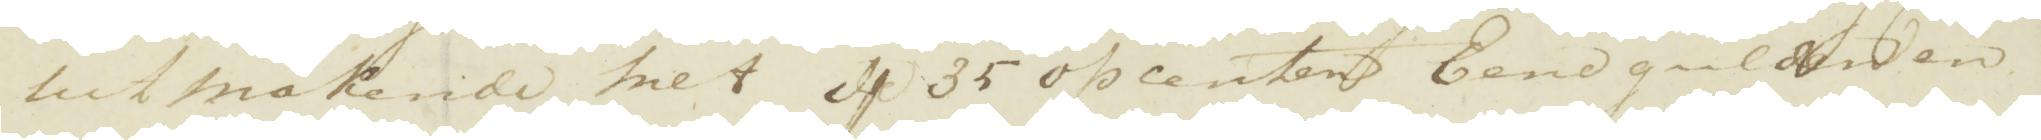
het makende met de 35 opcenten Eend gulden en
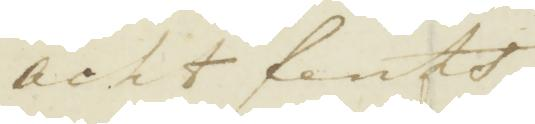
acht Cents.
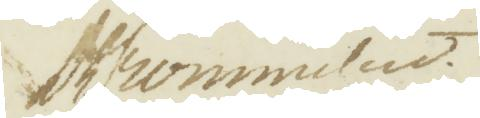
JH Crommelin.
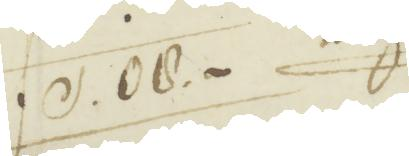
ƒ 1.08.-
